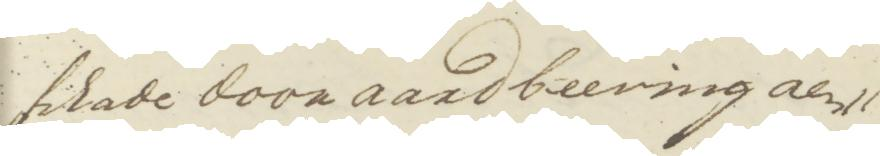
schade door aardbeeving aen„
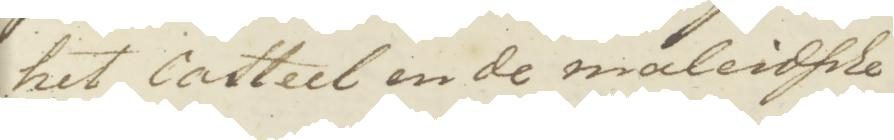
het Casteel en de maleidsche
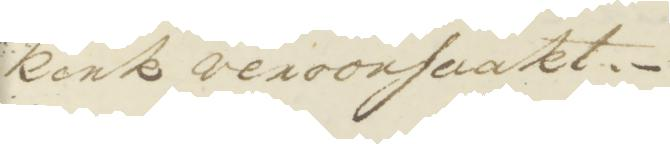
kerk veroorsaakt.-
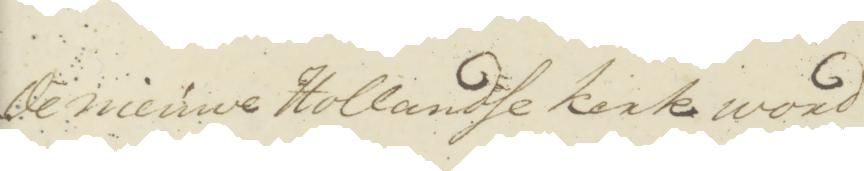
de nieuwe Hollandse kerk word
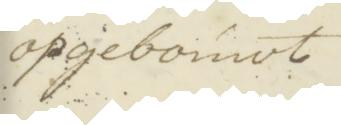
opgebouwt
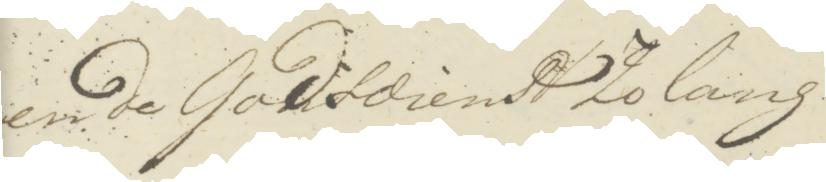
en de Godsdienst Zo lang
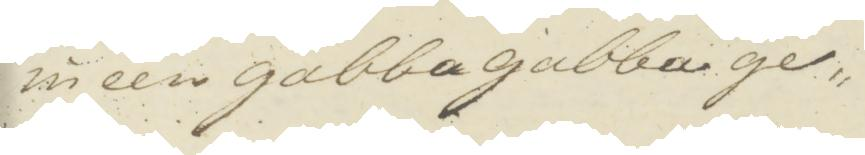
in een gabba gabba ge„
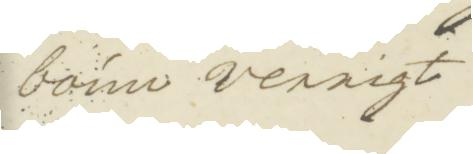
bouw verrigt
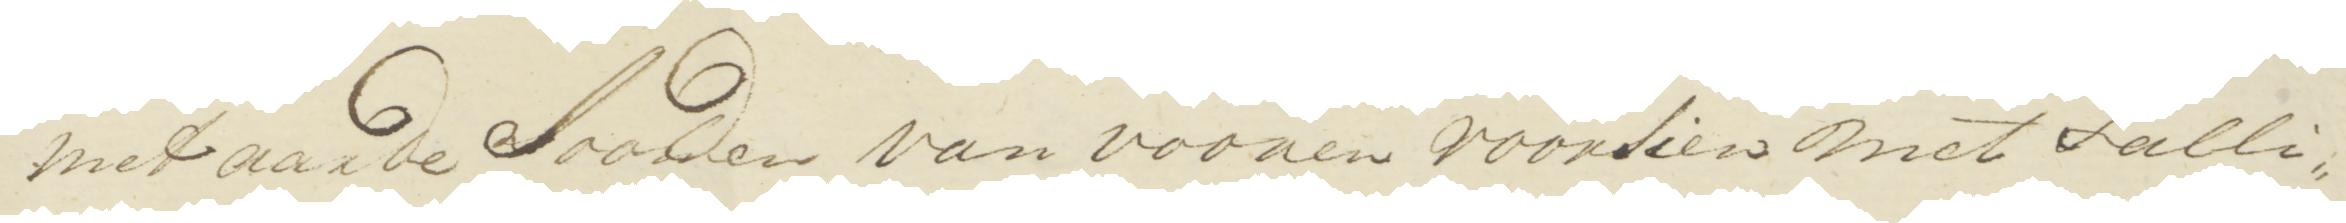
met aarde Sooden van vooren voorsien met Palli„
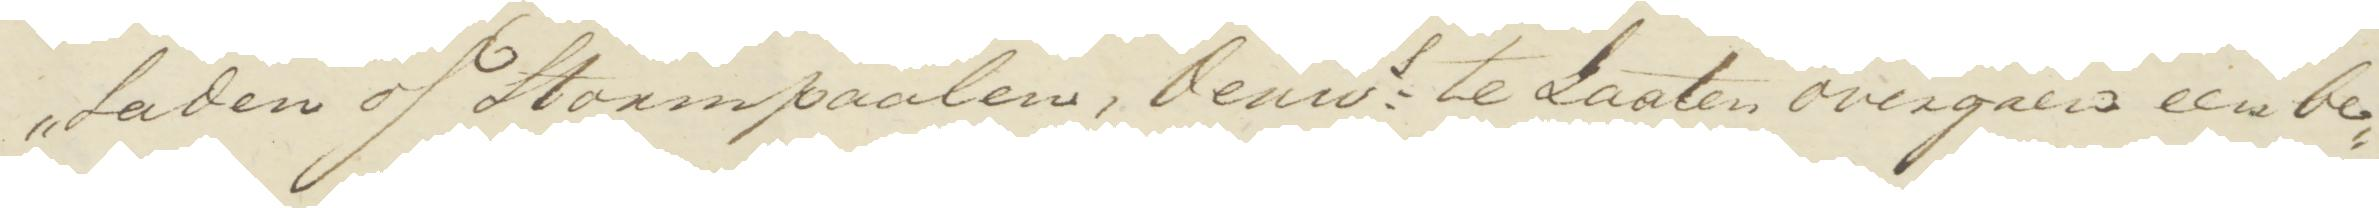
„saden of Stormpaalen, derw:s te Laaten overgaen een be„
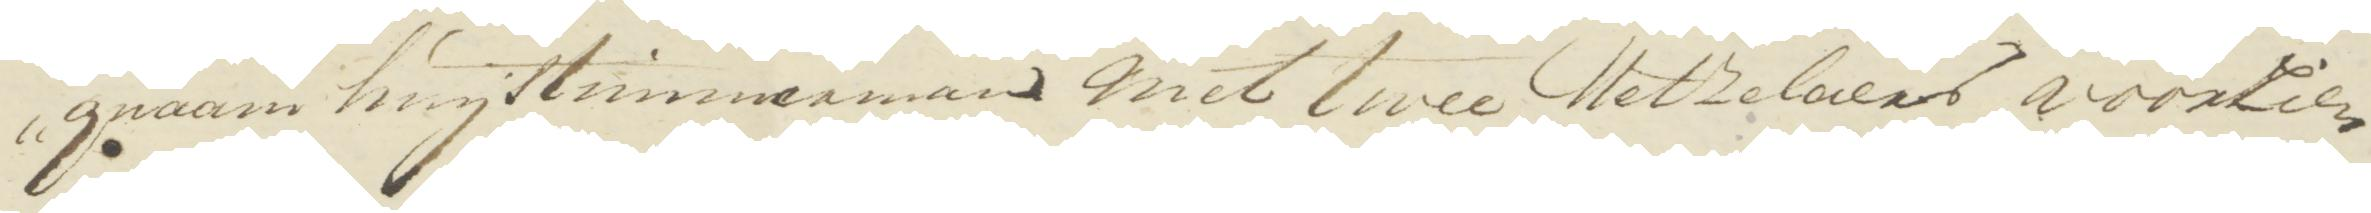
„quaam huystimmerman met twee Metzelaers voorzien
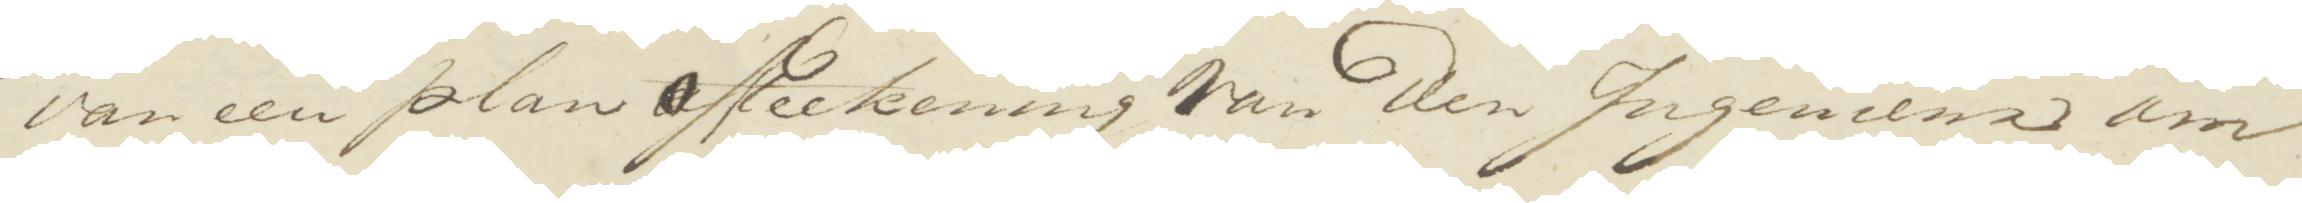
van een plan of teekening van den Jngenieur om
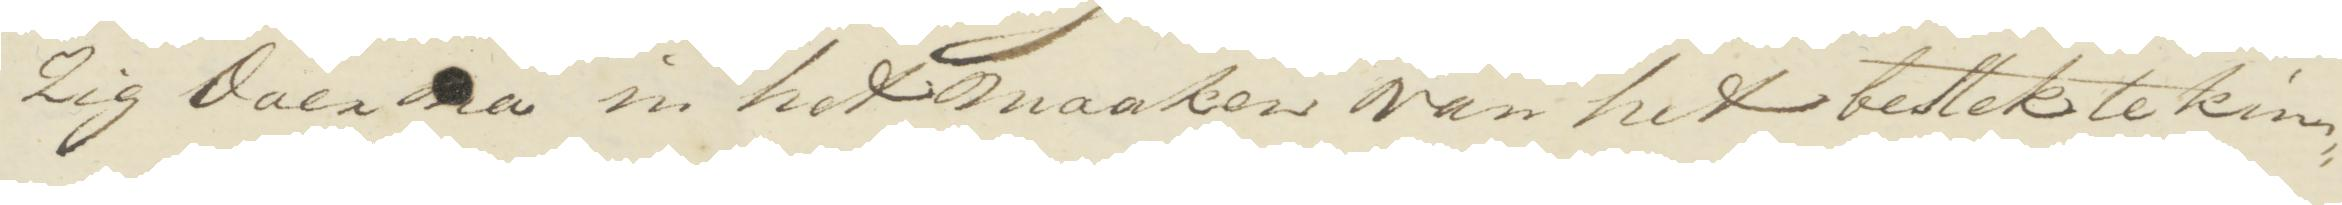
Zig daer na in het maaken van het bestek te kun„
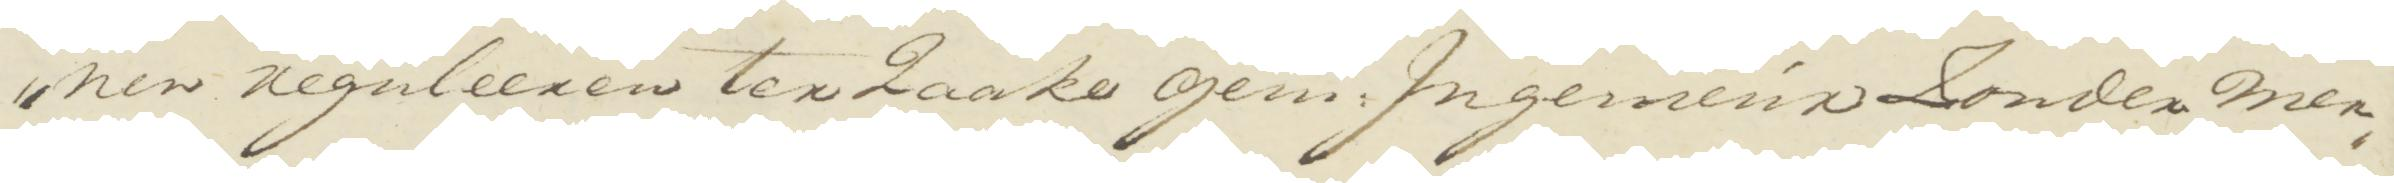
„nen reguleeren ter Zaake gem: Jngenieur Zonder mer„
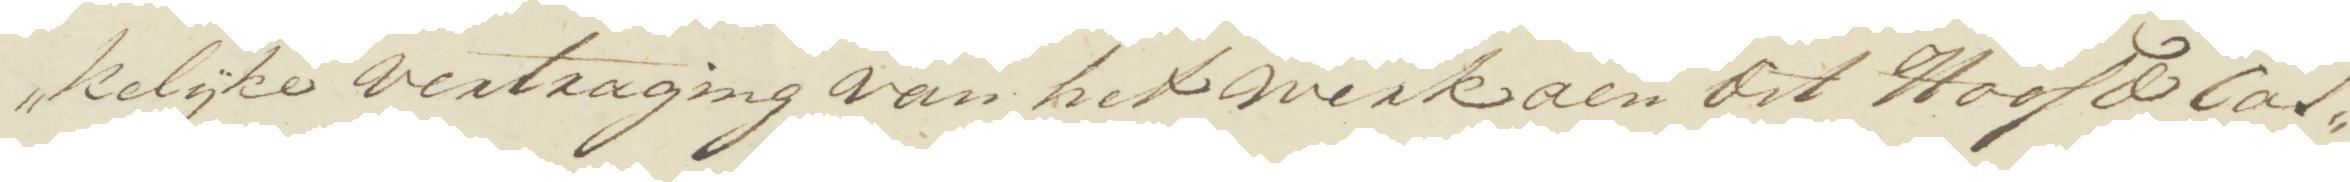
„kelijke vertraging van het werk aen dit Hoofd Cas„
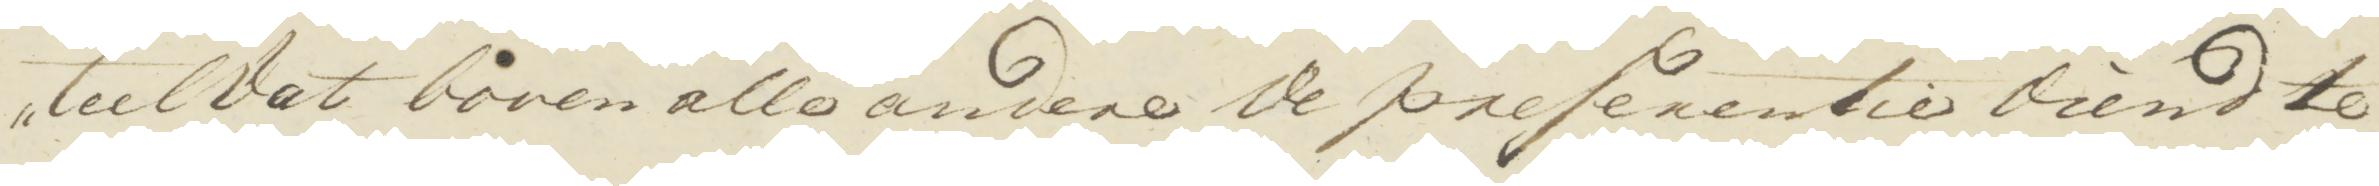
„teel dat boven alle andere de preferentie diend te
